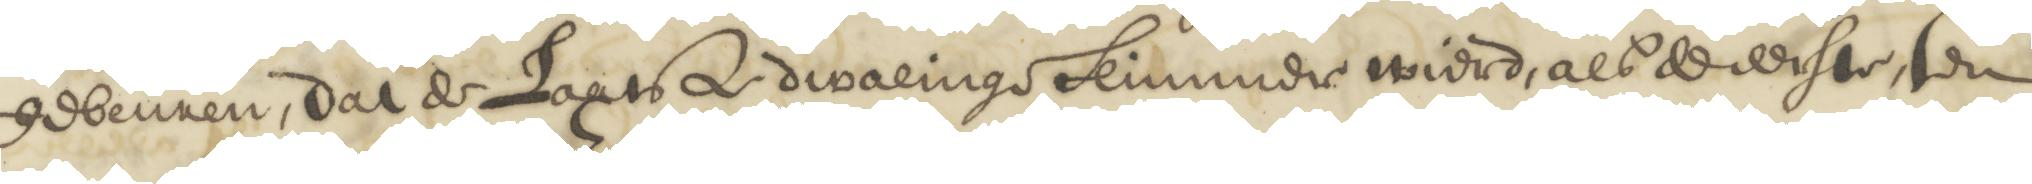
gebeuren, dat de Laatst dwalinge slimmer wierd, als de eerste, ten
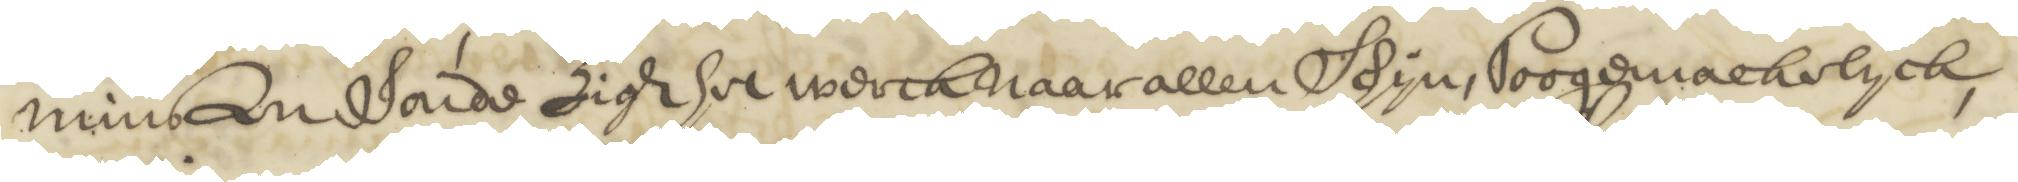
minsten soude zigh het werck naar allen schijn, soogemackelijck,
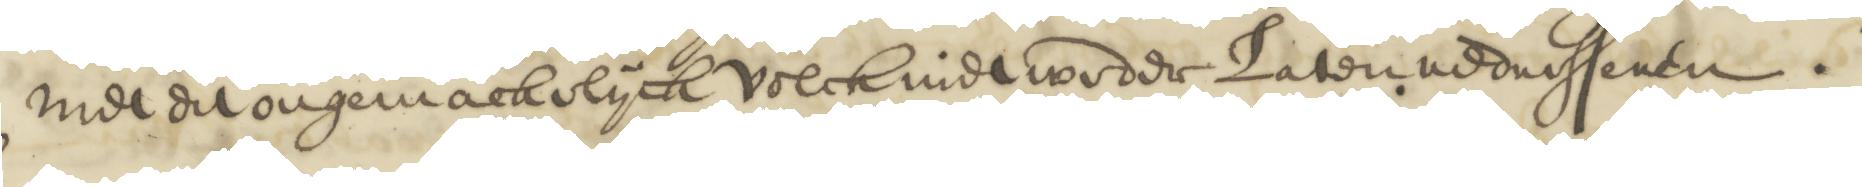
met dit ongemackelijck volck niet weder Laten redresseren.
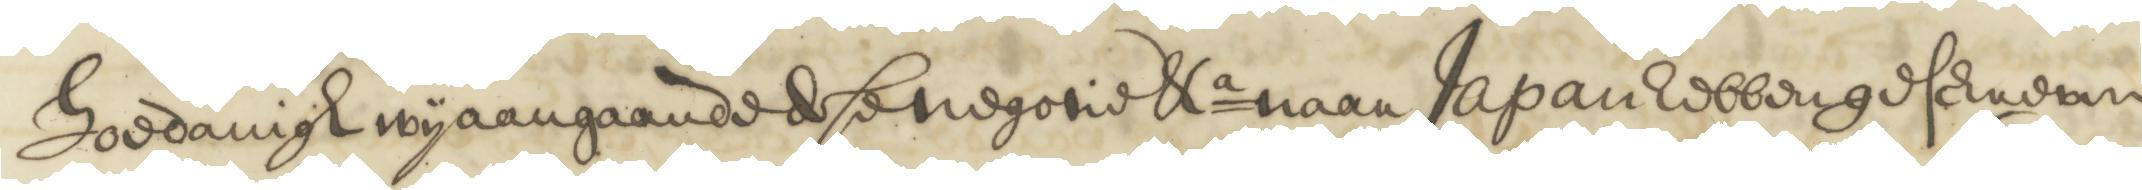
Hoedanigh wij aangaande dese negotie &=a naar Japan hebben geschreven
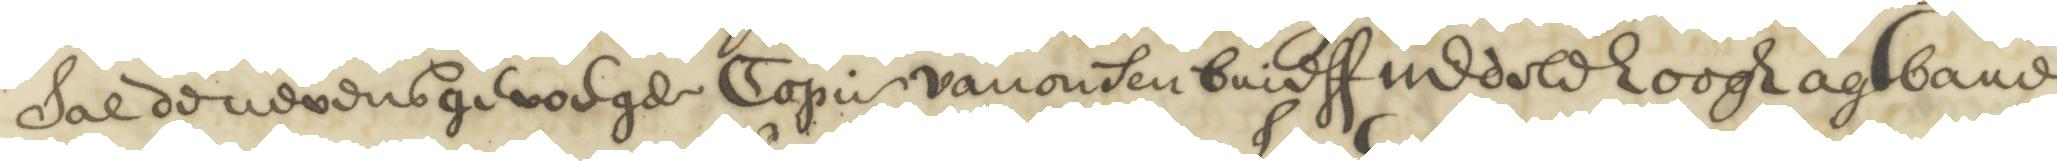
sal de nevens gevoegde Copie van onsen brieff uEdele hoogh agtbare
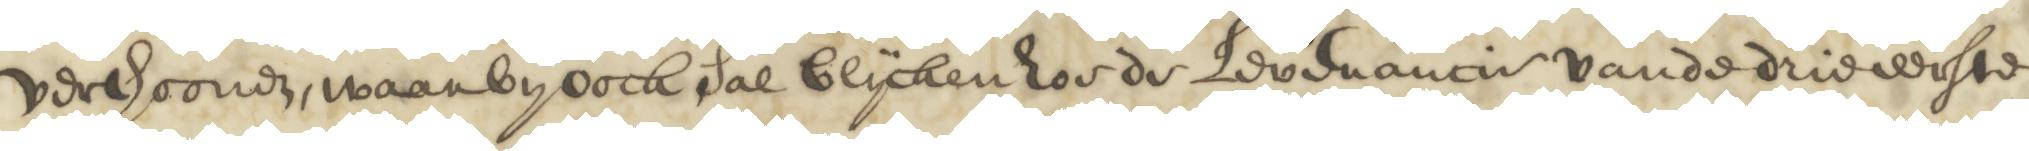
verthoonen, waar by oock sal blijcken hoe de Leverancie vande drie eerste
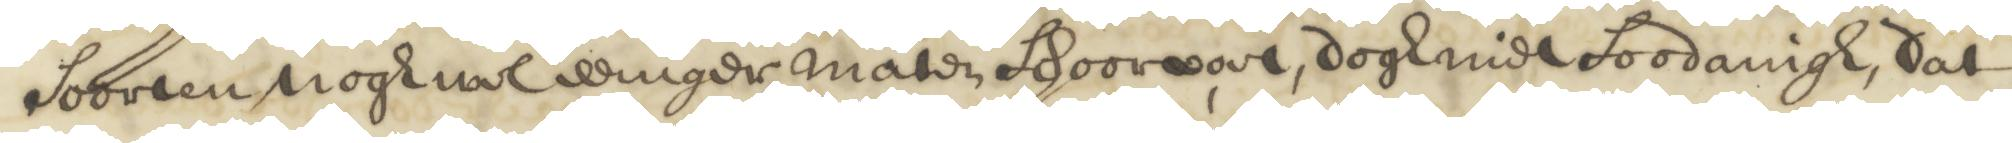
soorten nogh wel eeniger maten schoorvoet, dogh niet soodanigh, dat
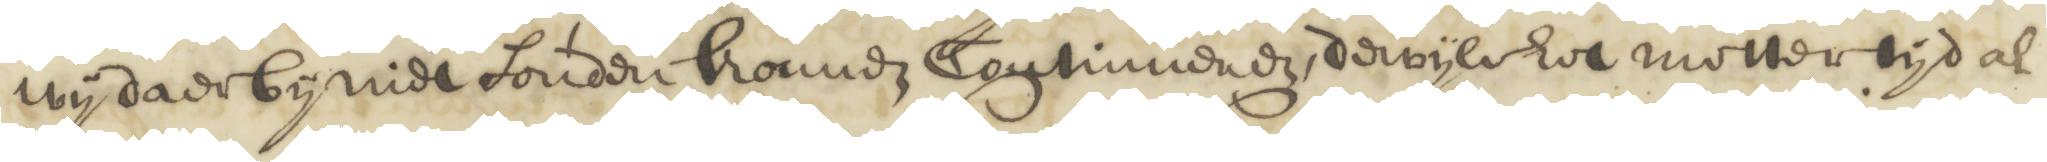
wij daerbij niet souden konnen Continueren, dewijle het metter tijd al
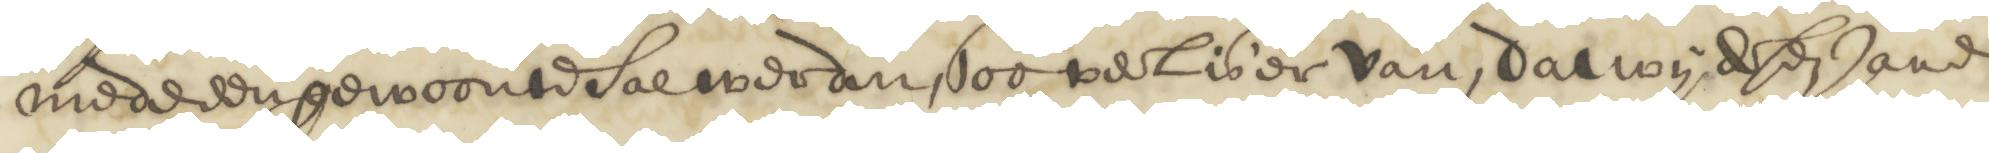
mede een gewoonte sal werden, soo veel is 'er van, dat wij desen Jare
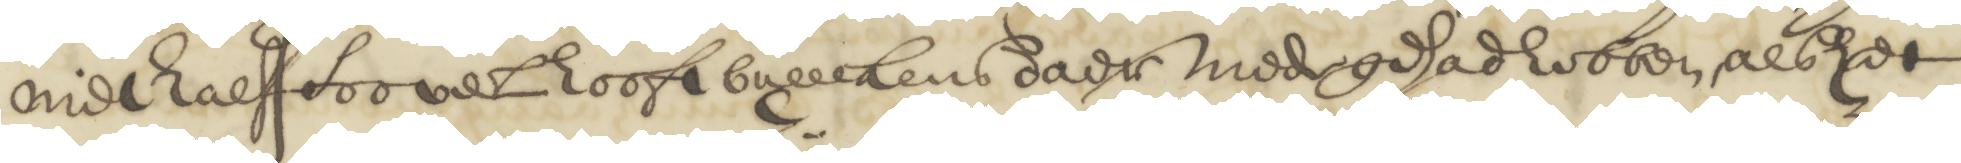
niet halff soo veel hooft breeckens daer mede gehad hebben, als het
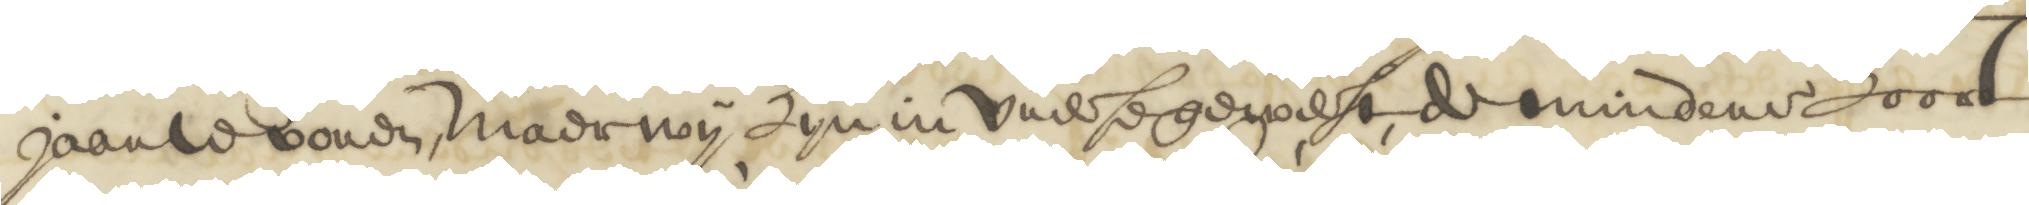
Jaar te voren, maer wij zijn in vreese gewest, de mindere zoort
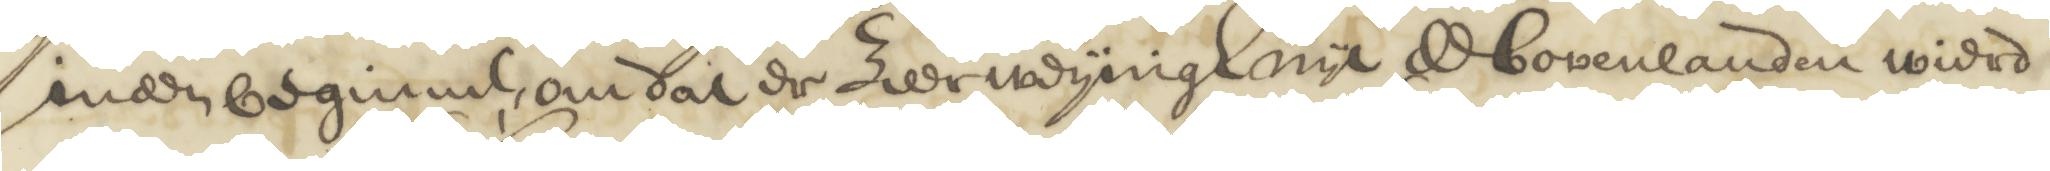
inden beginne, om dat 'er zeer weijnigh uijt de bovenlanden wierd
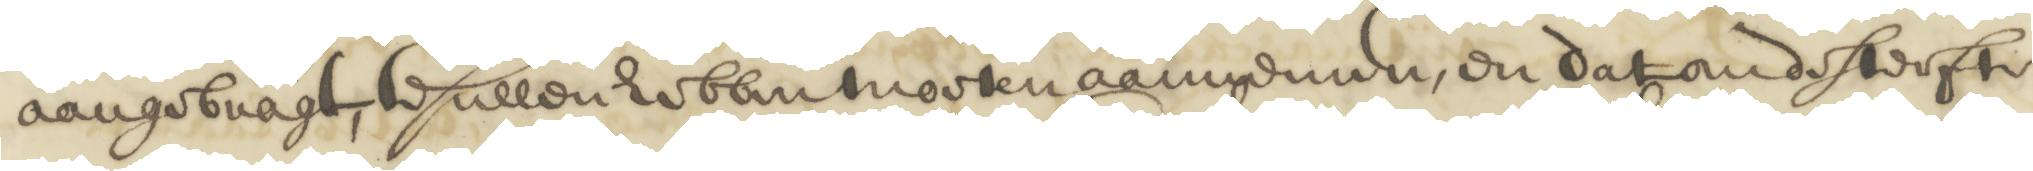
aangebragt, te sullen hebben moeten aannemen, en dat om de sterfte
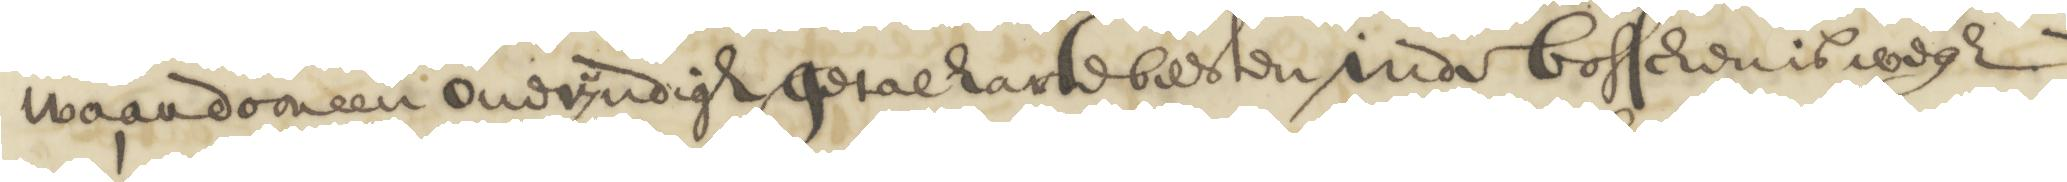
waar door een oneijndigh getalharte beesten inde bosschen is wegh
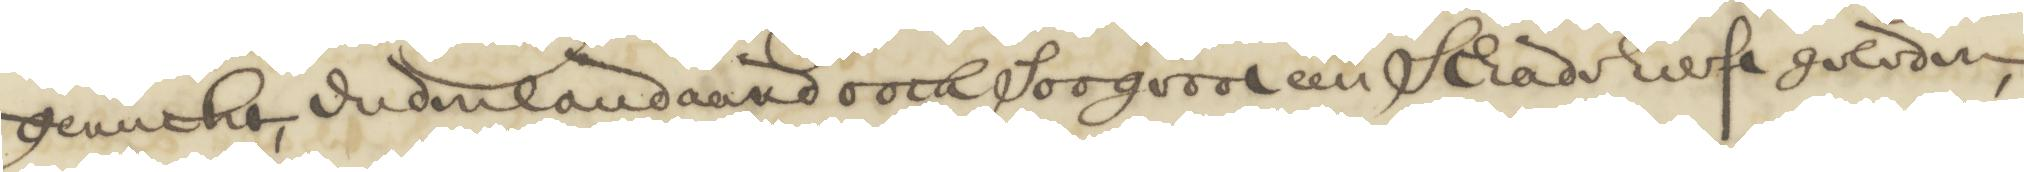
geruckt, en den landaard oock soo groot een schade heeft geleden,
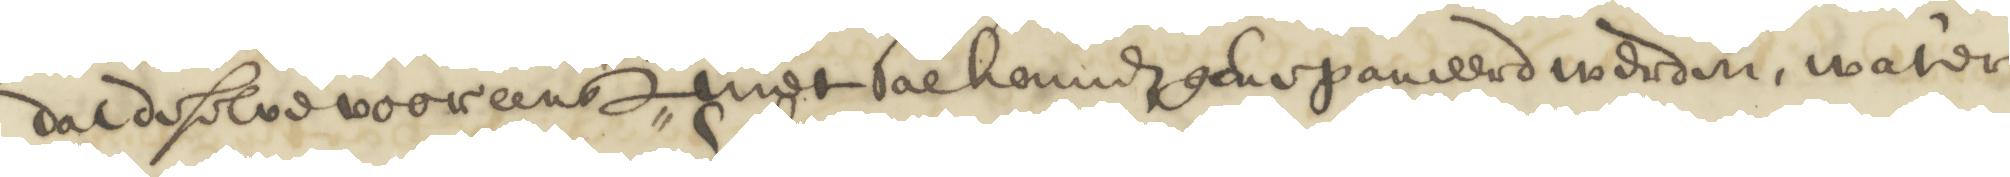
dat deselve voor eerst „nogh niet sal konnen gerepareerd werden, wat'er
